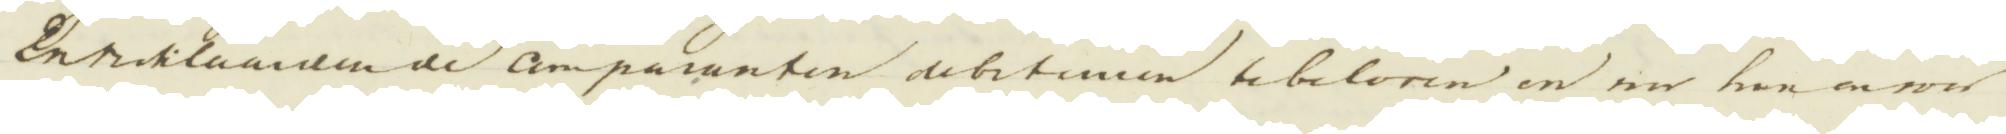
En verklaarden de comparanten debiteuren te beloven en voor hun en voor
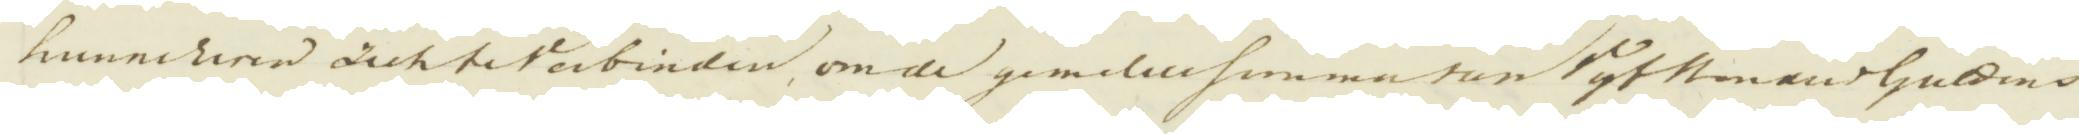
hunne Erven Zich te Verbinden, om de gemelde Somma van Vyf Honderd Guldens
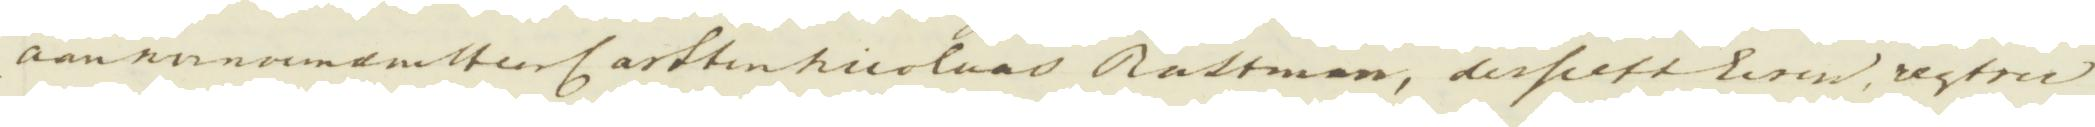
aan voornoemden Heer Carsten Nicolaas Rustman, desselfs Erven, regtver
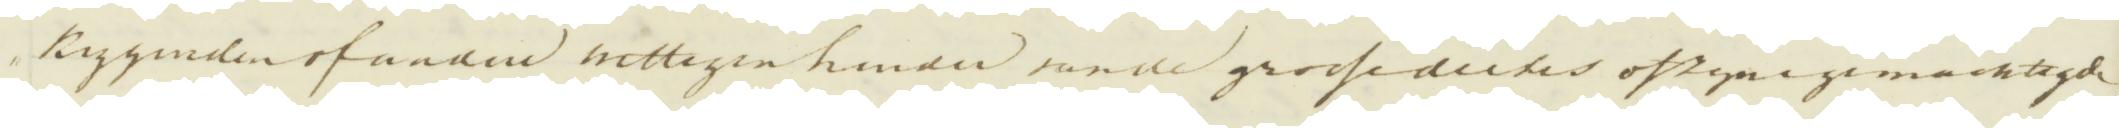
„krygenden of andere wettigen houder van de grosse deeses of Zyne gemachtigde
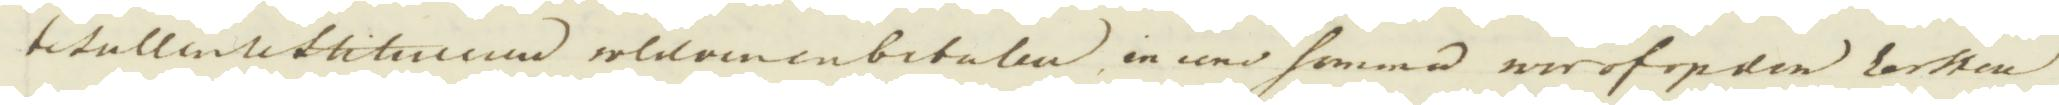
te Zullen restitueeren voldoen en betalen, in eene Somma voor of op den Eersten
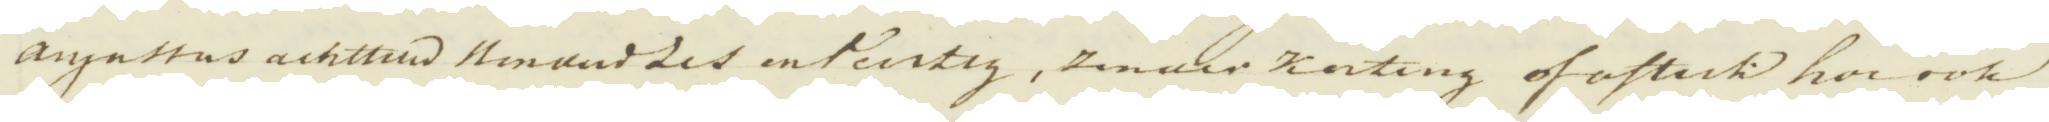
augustus achttien Honderd Zes en Veertig, Zonder Korting of aftrek hoe ook
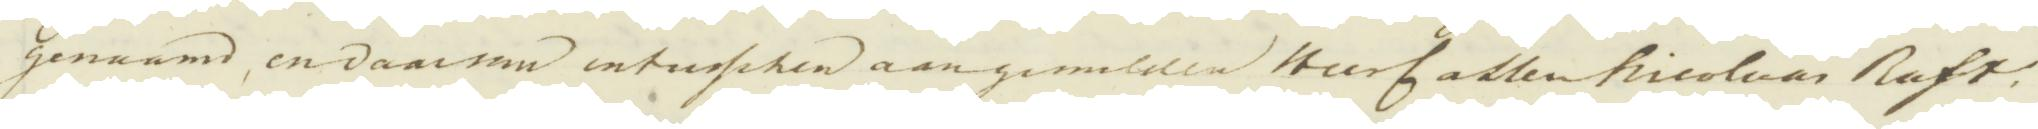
genaamd, en daarvan intusschen aan gemelden Heer Carsten Nicolaas Rust,
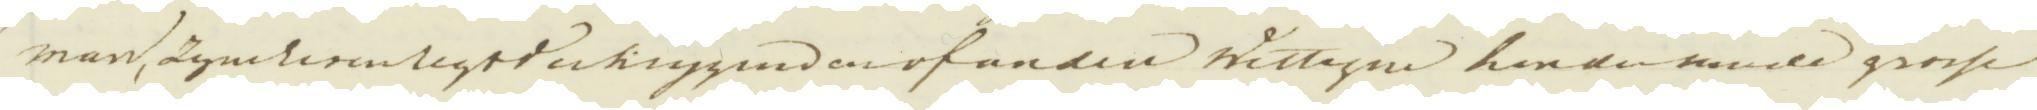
man, Zyne Erven regtverkrygenden of andere Wettigen houder van de grosse
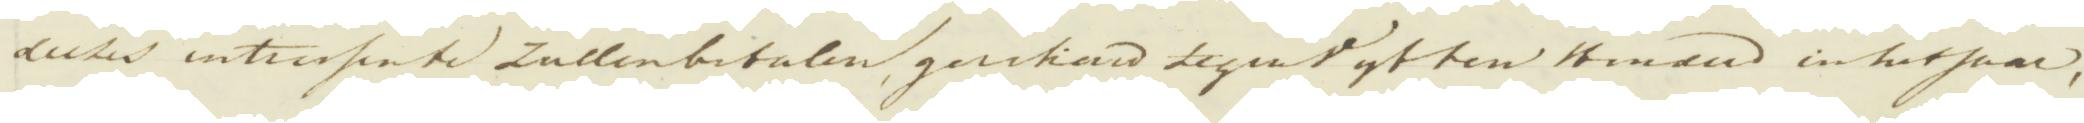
deezes intressen te Zullen betalen, gerekend tegen Vyf ten Honderd in het jaar,
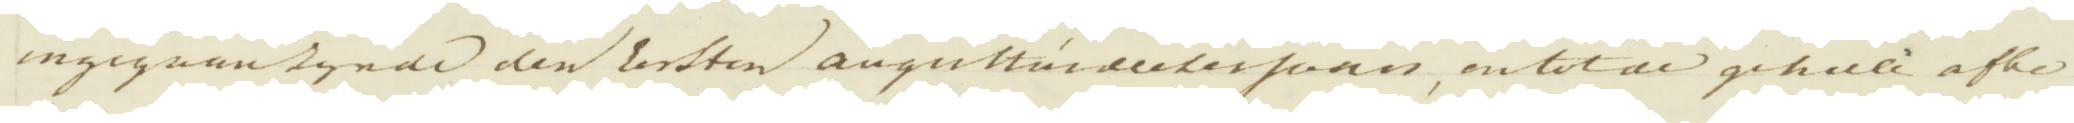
ingegaan Zynde den Eersten augustus deezes Jaars, en tot de geheele afbe
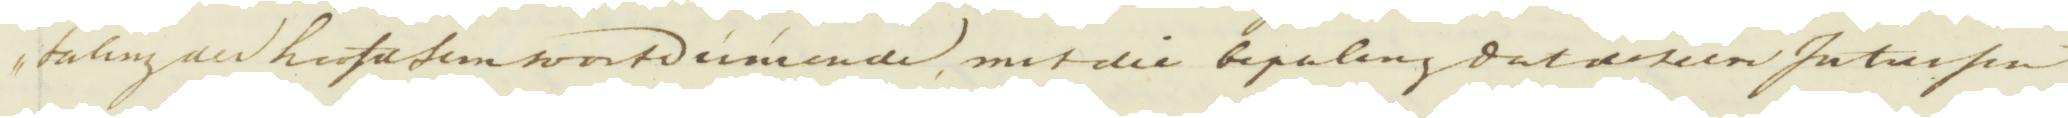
„taling der hoofdsom voortduurende, met die bepaling dat dezelve Jntressen
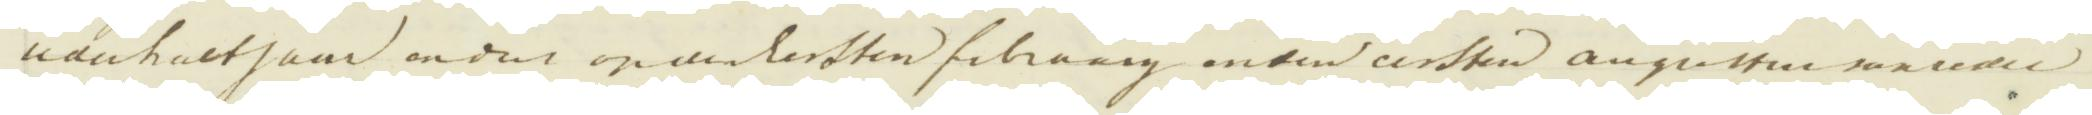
ieder half jaar en dat op den Eersten february en den eersten augustus van ieder
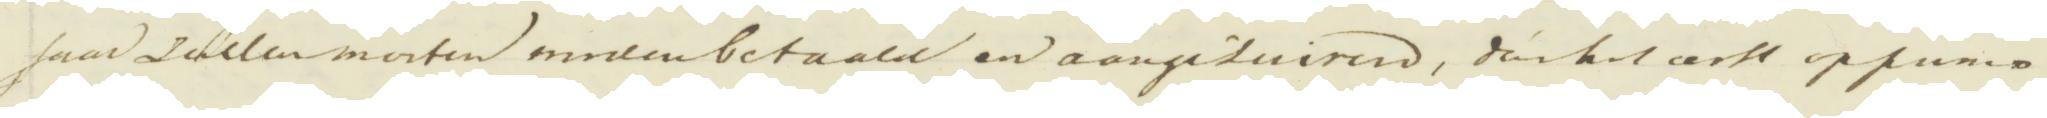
jaar Zullen moeten worden betaald en aangezuiverd, dus het eerst op primo
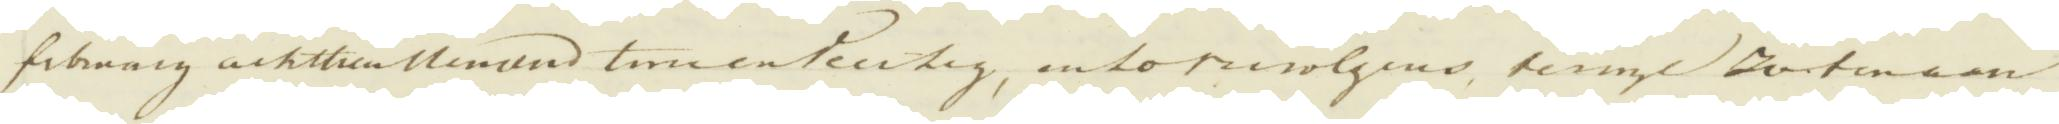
february achttien Honderd twee en Veertig, en Zo vervolgens, terwyl Zo ten aan
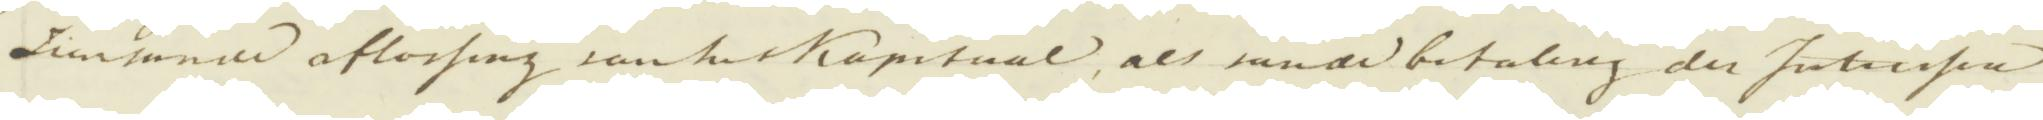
Zien van de aflossing van het Kapitaal, als van de betaling der Jntressen
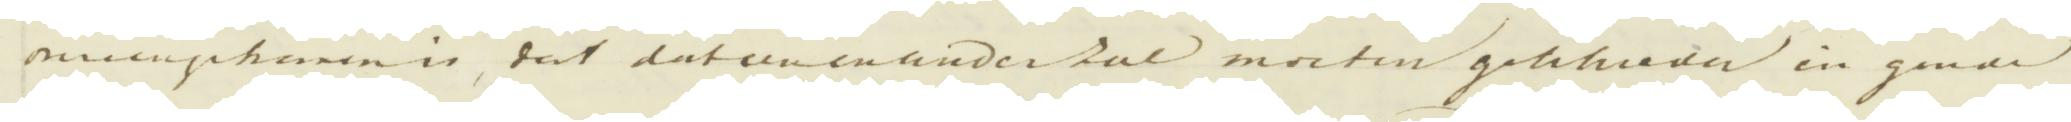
overeengekomen is, dat dat een en ander Zal moeten geschieden in goude
